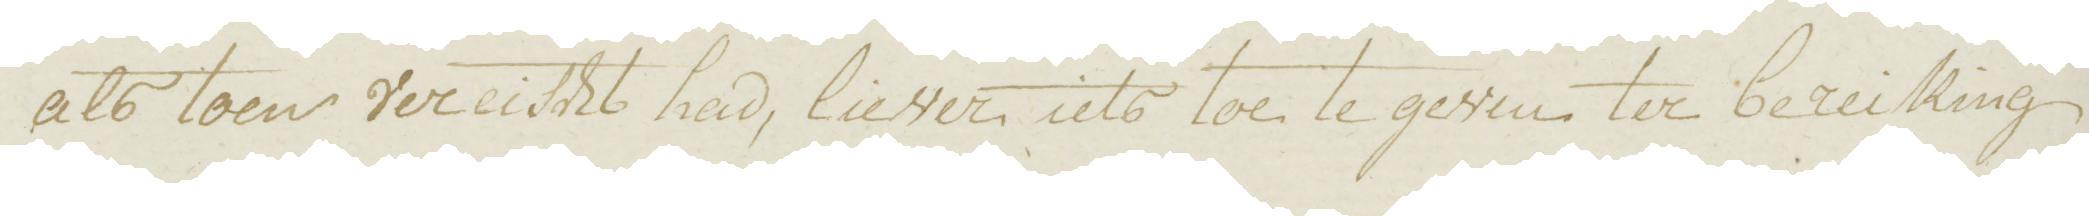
als toen vereischt had, liever iets toe te geven ter bereiking
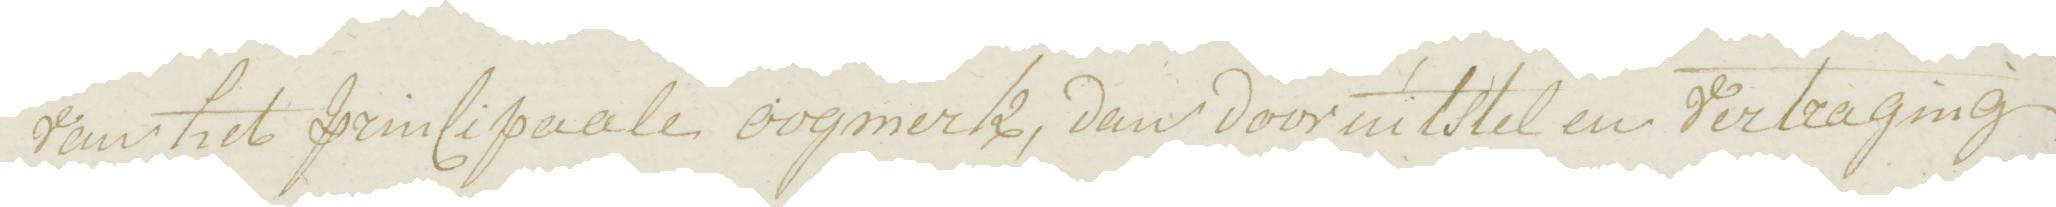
van het principaale oogmerk, dan door uitstel en vertraging
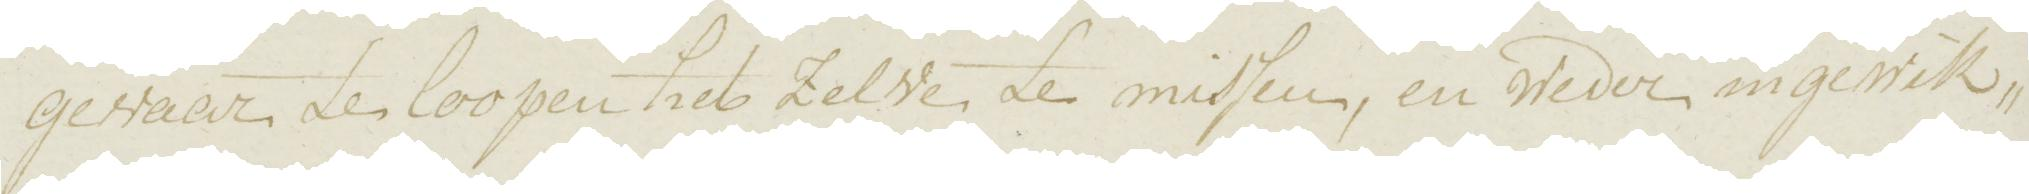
gevaar te loopen het zelve te missen, en weder ingewik„
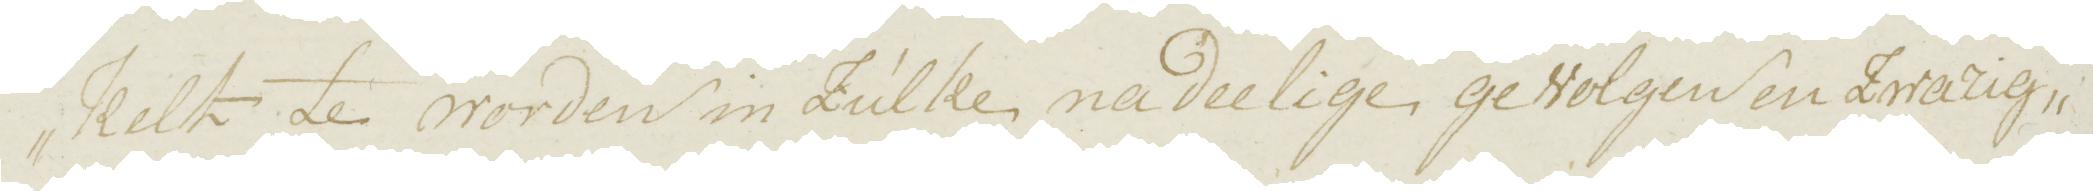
„kelt te worden in zulke nadeelige gevolgen en zwarig„
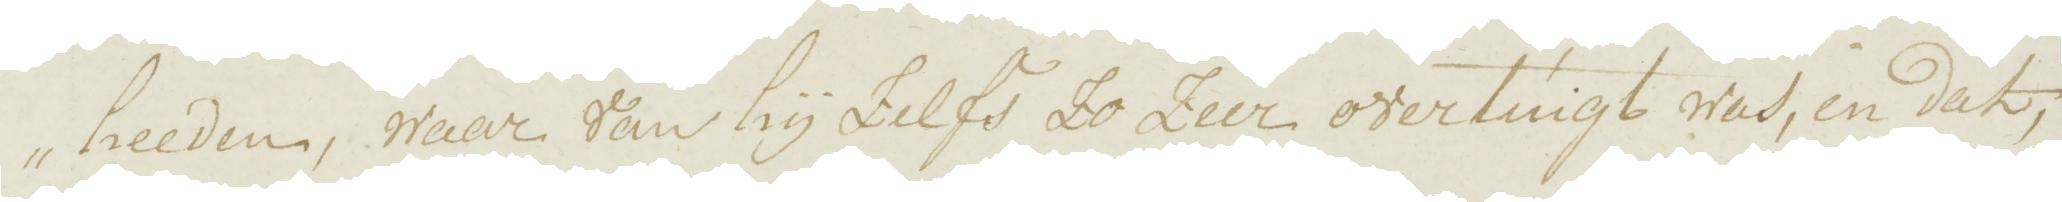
„heeden, waar van hij zelfs zo zeer overtuigt was, en dat,
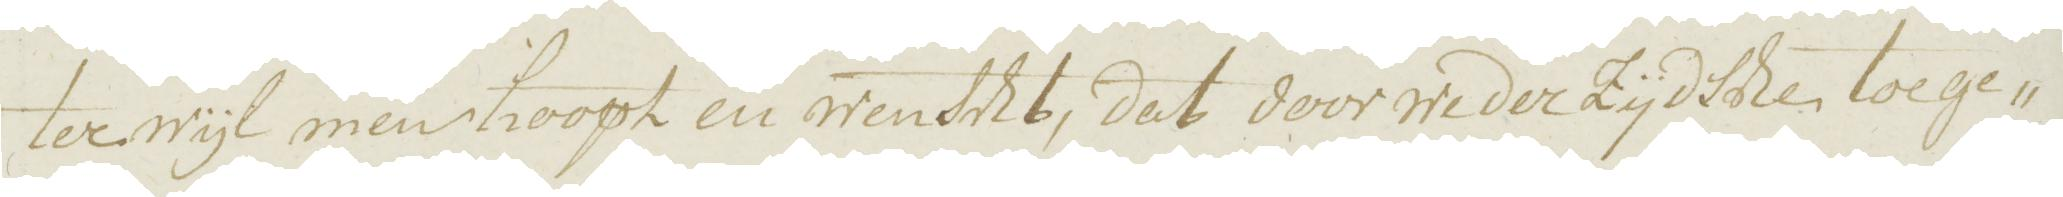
terwijl men hoopt en wenscht, dat door wederzijdsche toege„
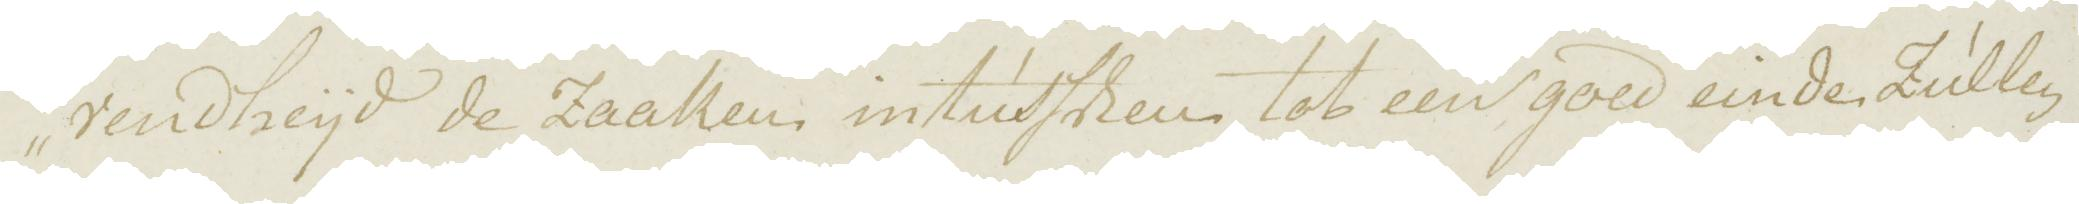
„vendheijd de zaaken intusschen tot een goed einde zullen
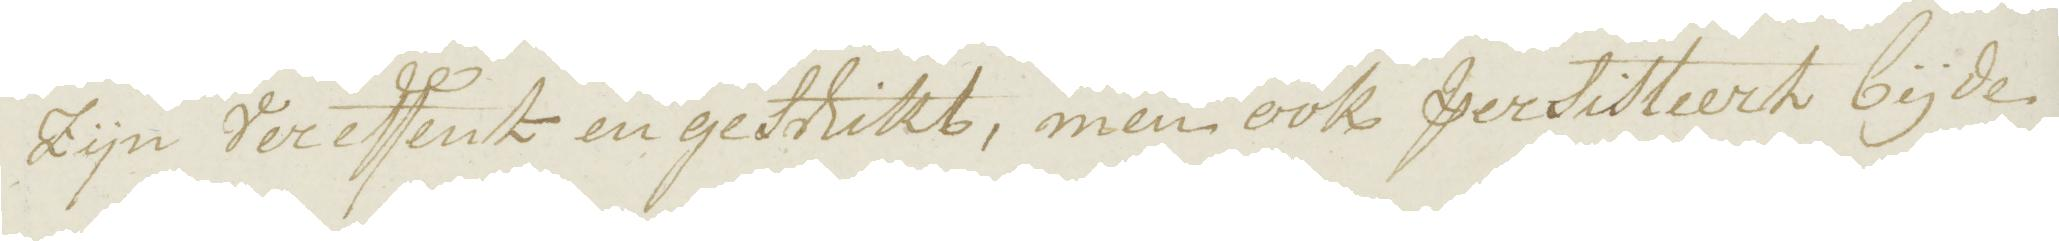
zijn vereffent en geschikt, men ook persisteert bij de
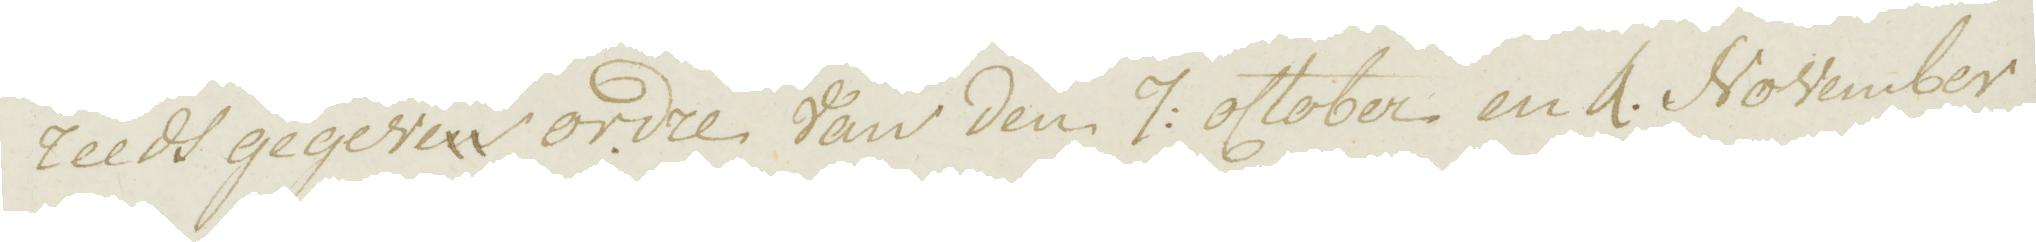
reeds gegeven ordre van den 7: october en 4. November
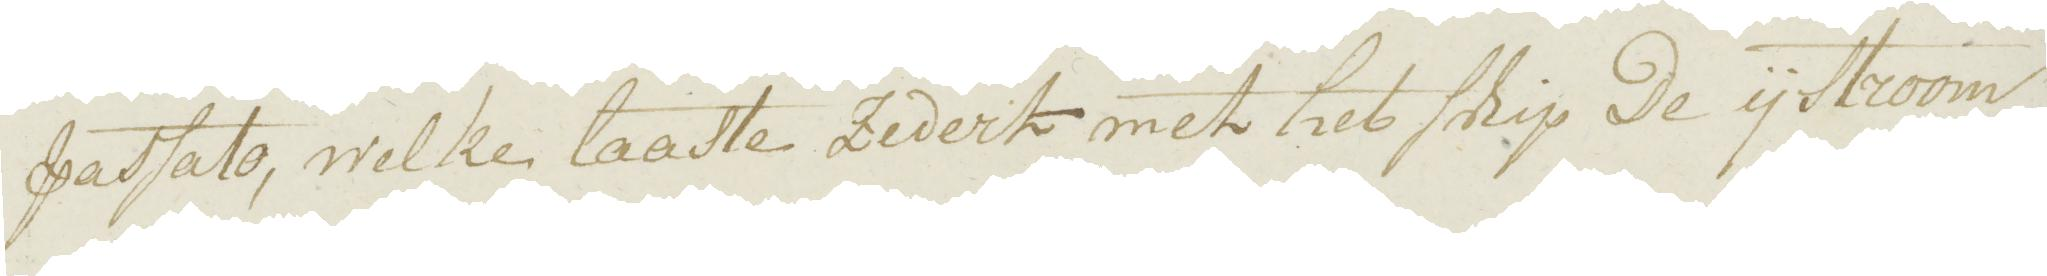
passato, welke laaste zedert met het schip De ijstroom
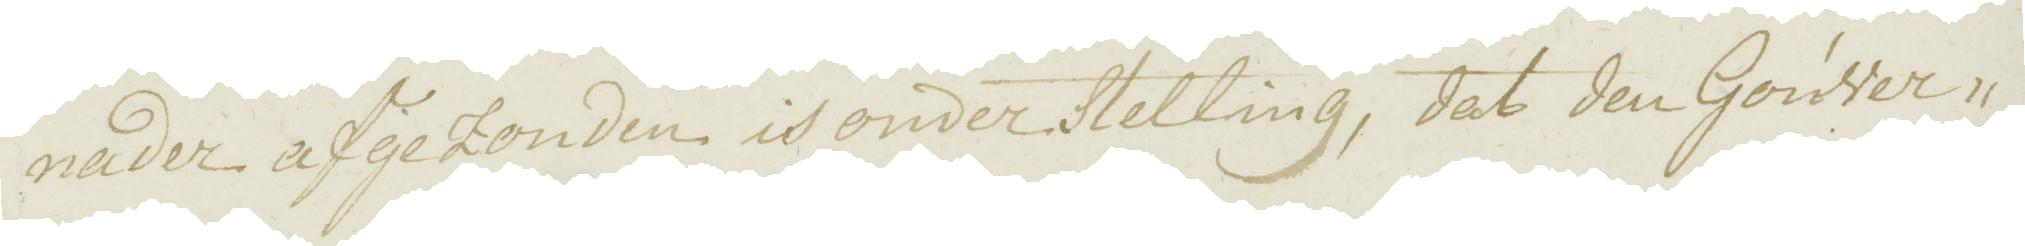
nader afgezonden is onder stelling, dat den gouver„
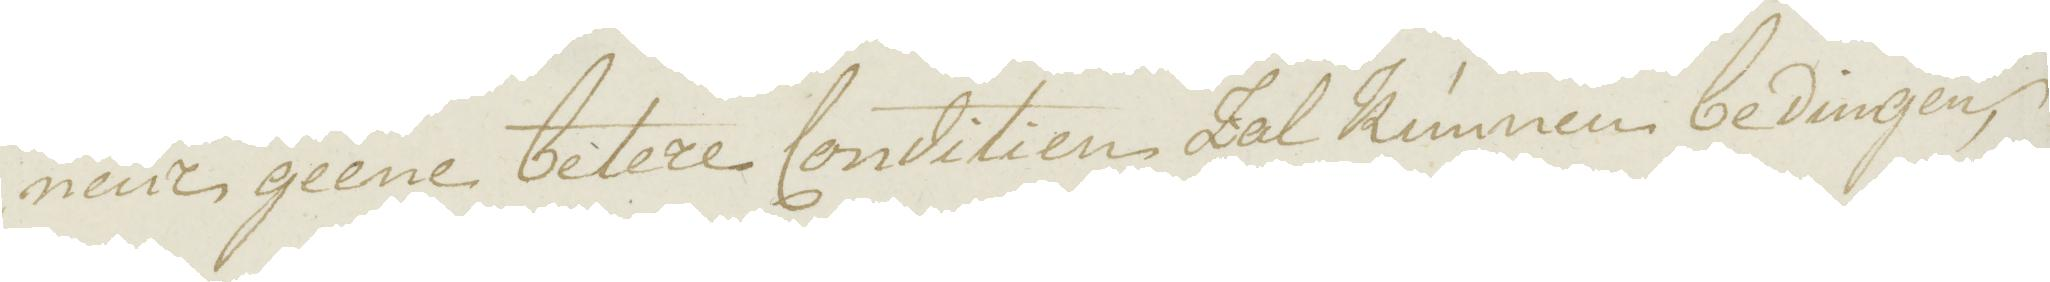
neur geene betere conditien zal kunnen bedingen,
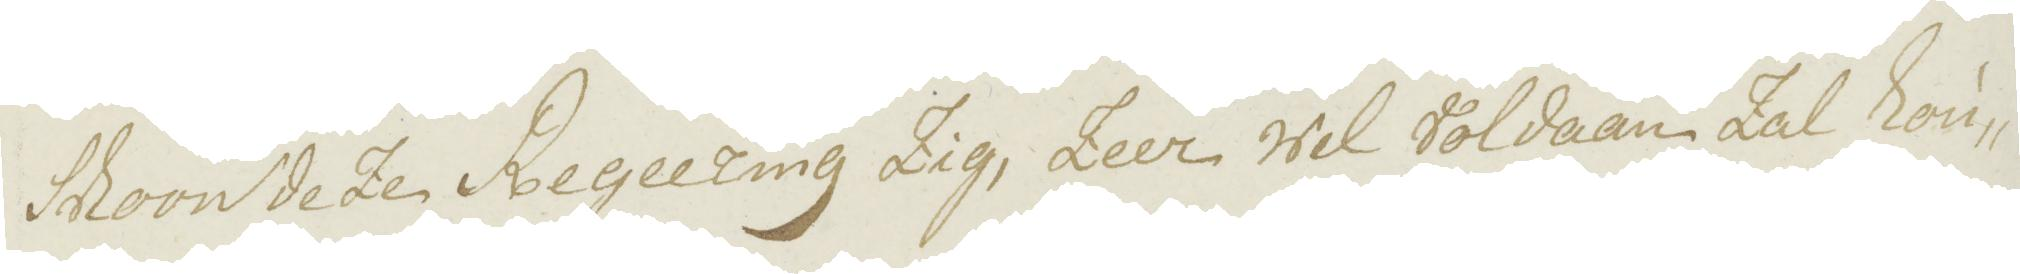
schoon deze Regeering zig, zeer wel voldaan zal hou„
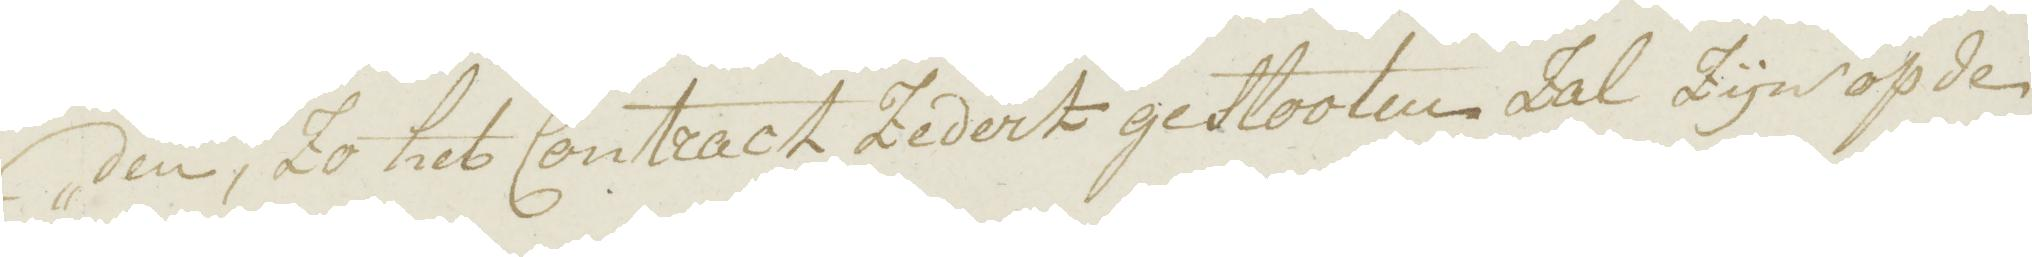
„den, zo het contract zedert geslooten zal zijn op de
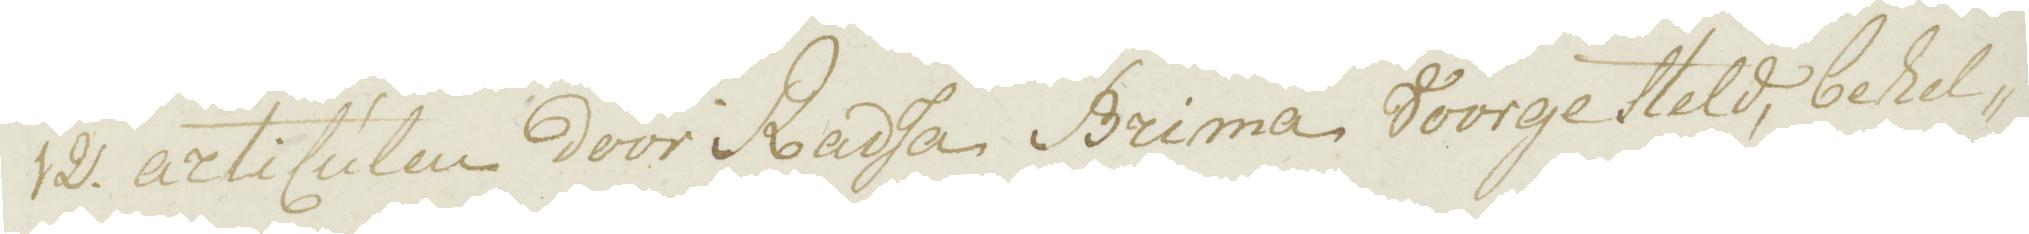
12. articulen door Radja Brima voorgesteld, behel„
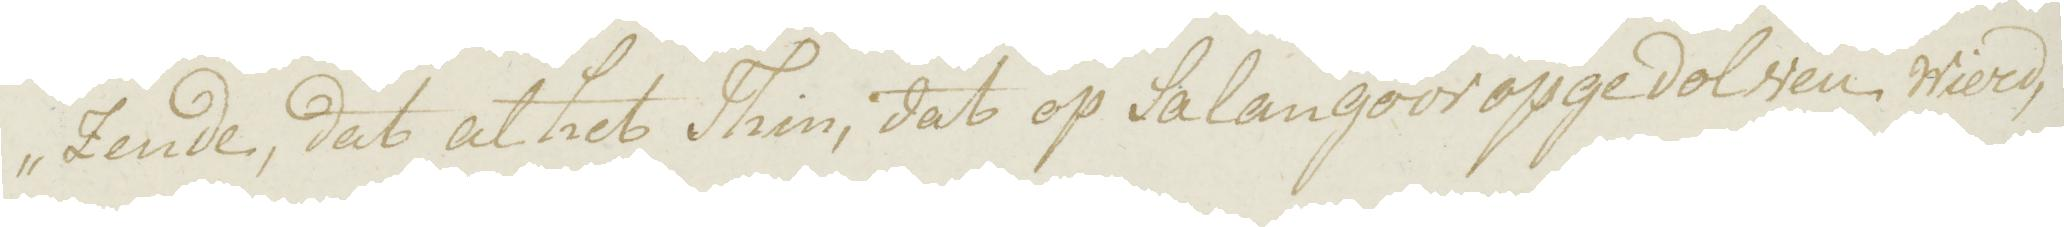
„zende, dat al het Thin, dat op salangoor opgedolven wierd,
